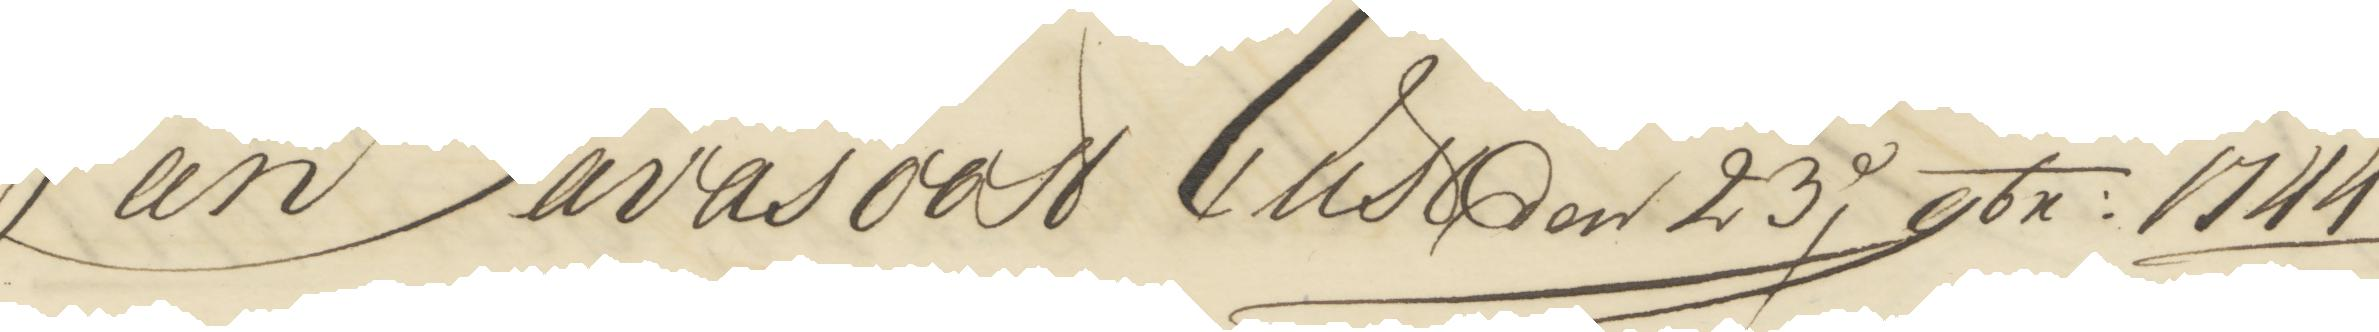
Van Javas oost Cust den 23,e 9br: 1744
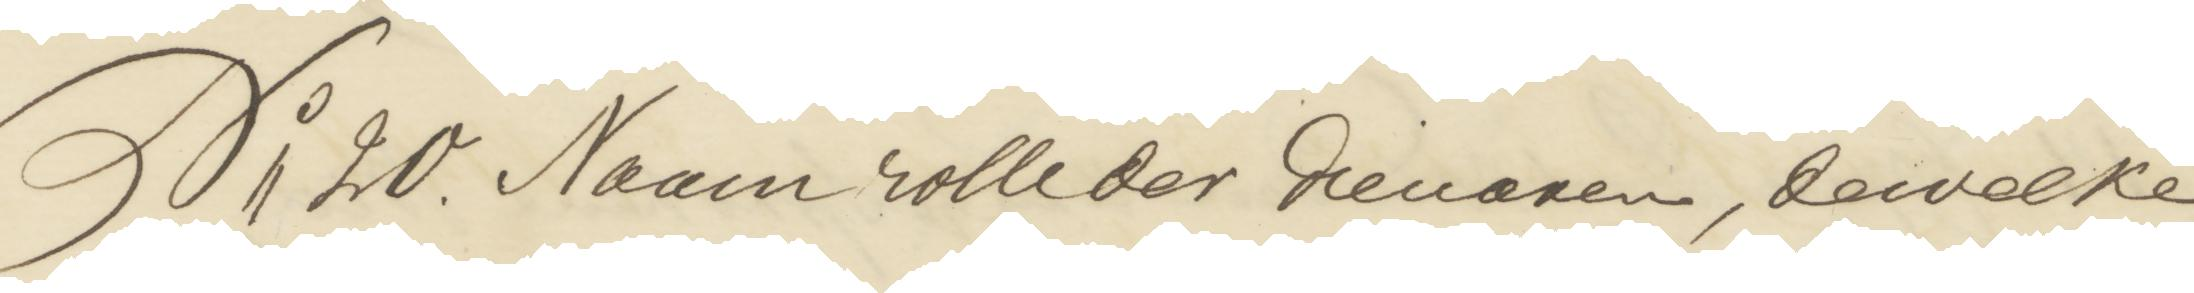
N„o 20. Naam rolle der dienaren, dewelke
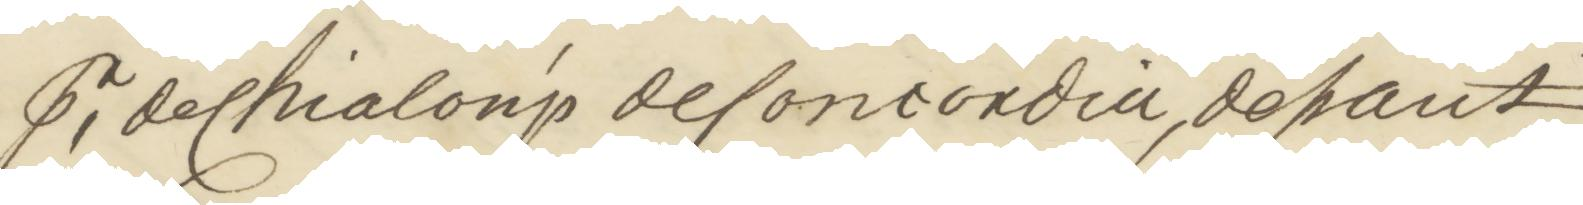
p,r de Chialoup de Concordia, de pant
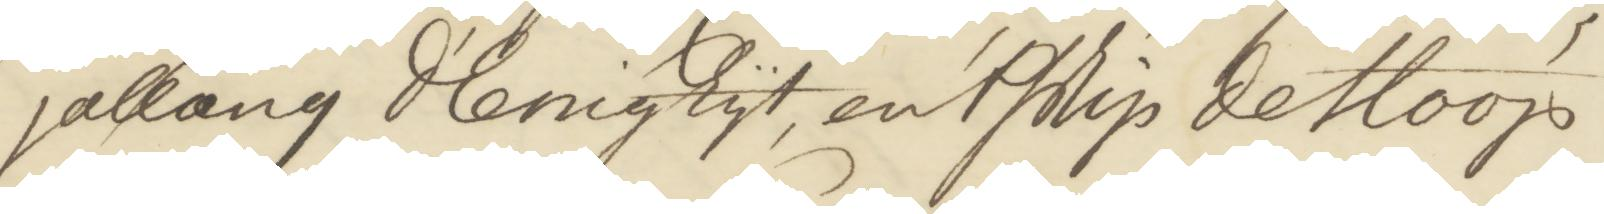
jallang d'Eenighijt, en’t schip de Hoop
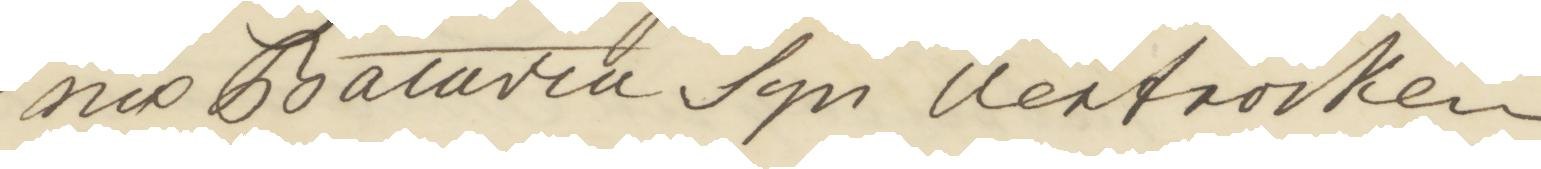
na Batavia sijn vertrocken
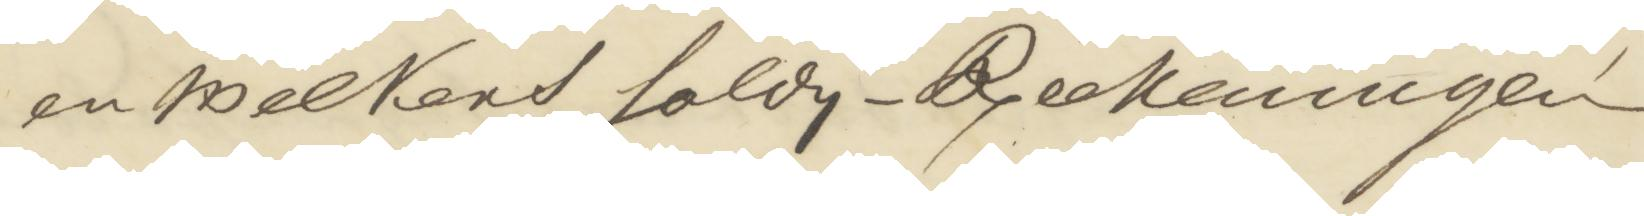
en welkers soldij-Reekeningen
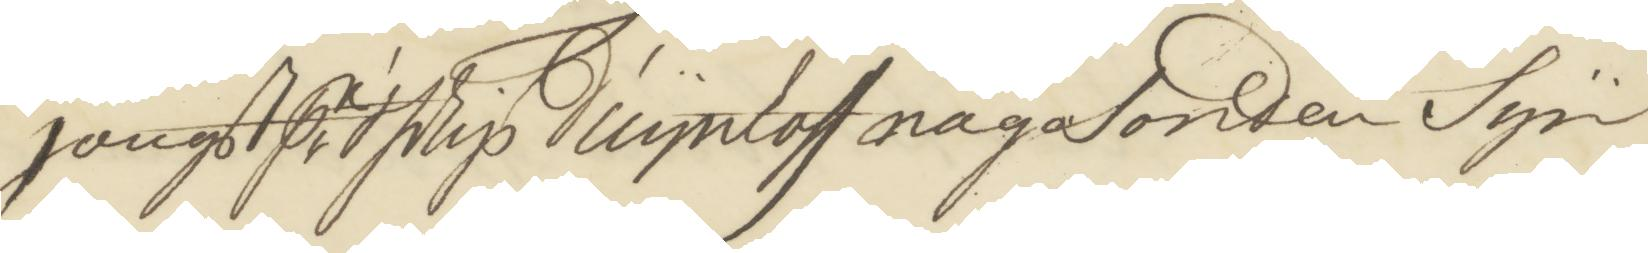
jongst p„r 't schip duijnhoff nagesonden sijn
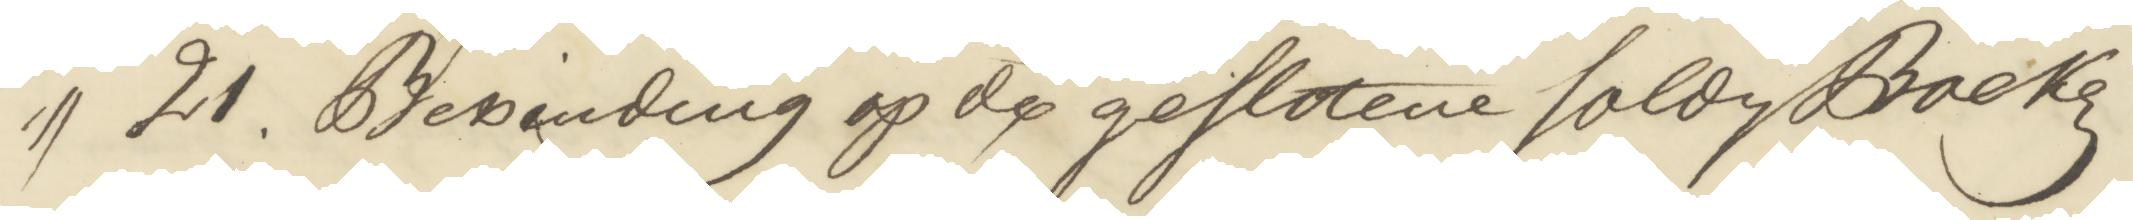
„ 21. Bevinding op de geslotene soldij Boeken
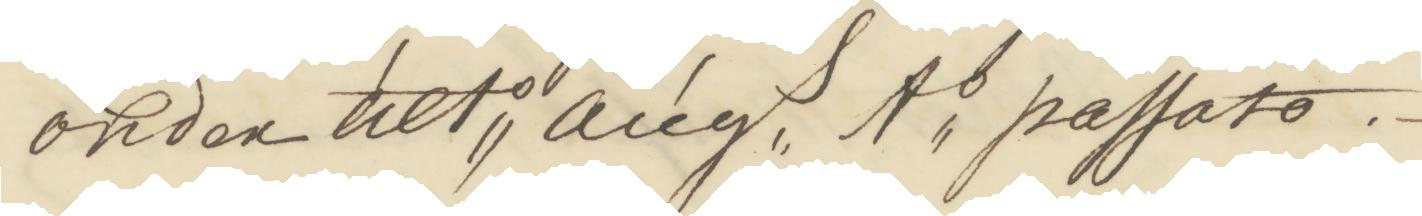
onder ult„o aug„s A„o passato.
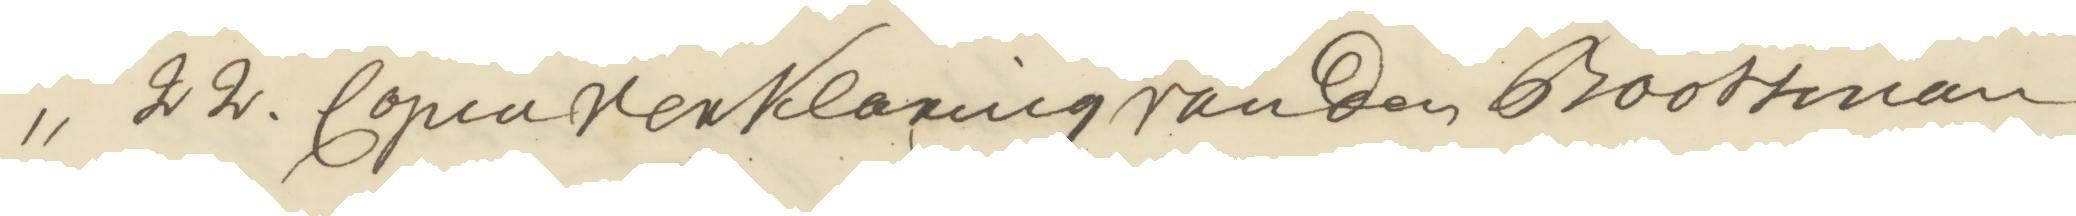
„ 22. Copia verklaring van den Bootsman
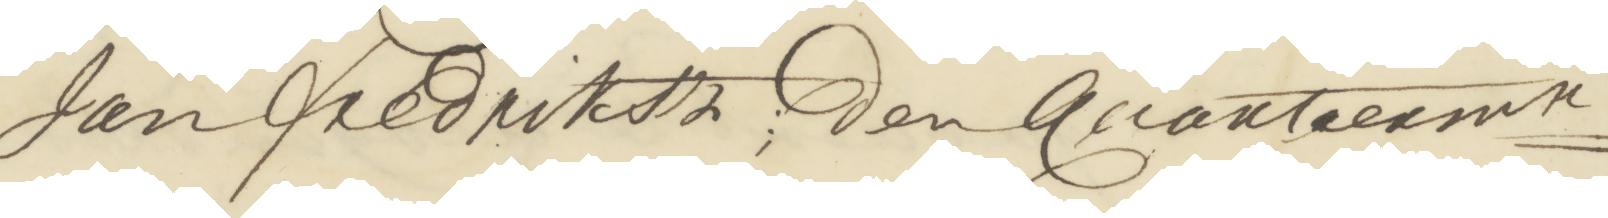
Jan fredriksz:, den quartierm=r
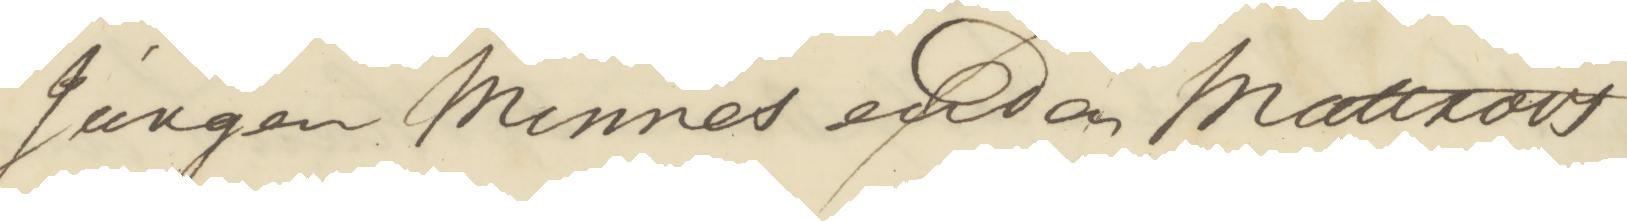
Jurgen Minnes enden Mattroos
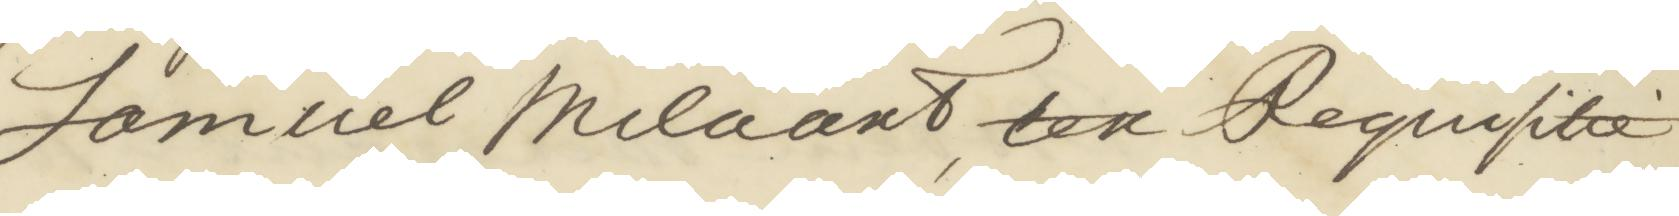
Samuel Milaart ter Requisitie
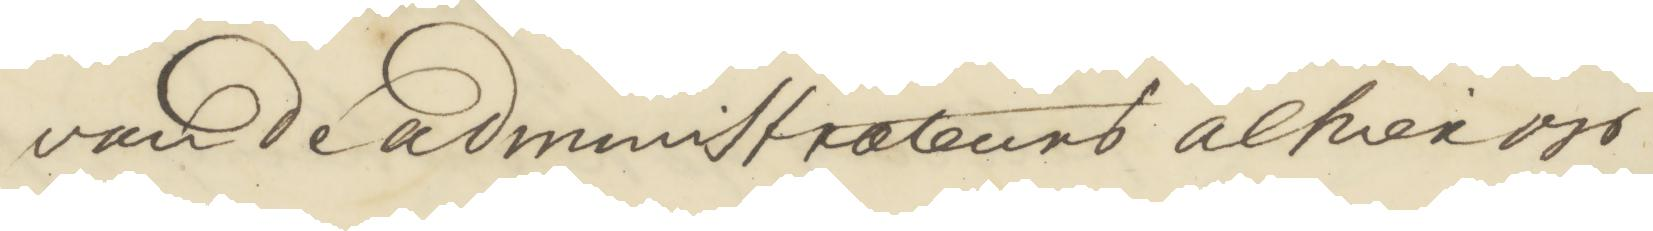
van de administrateurs alhier op
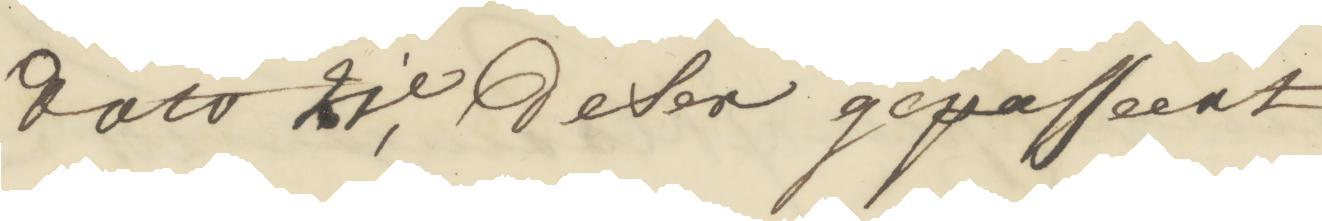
dato 21,e deser gepasseert
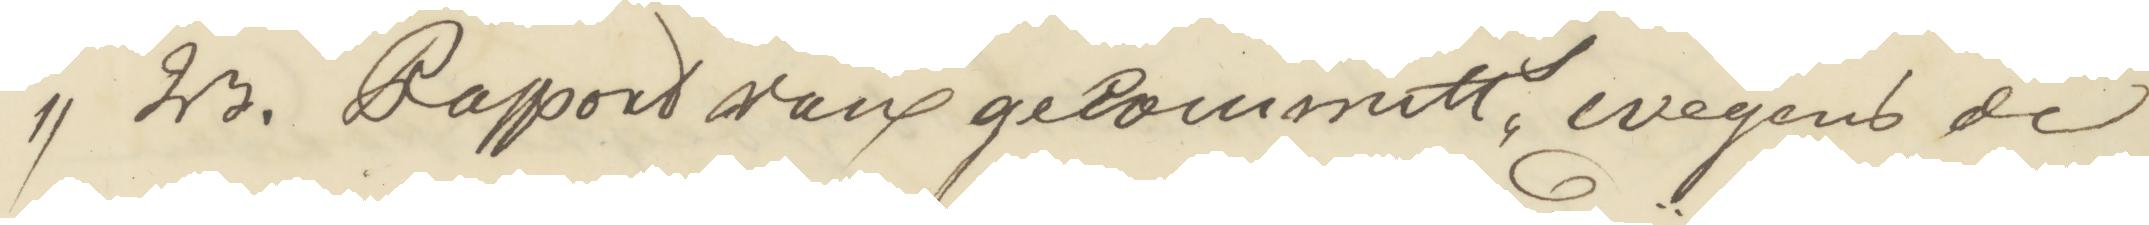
„ 23. Rapport van gecommitt„s wegens de
